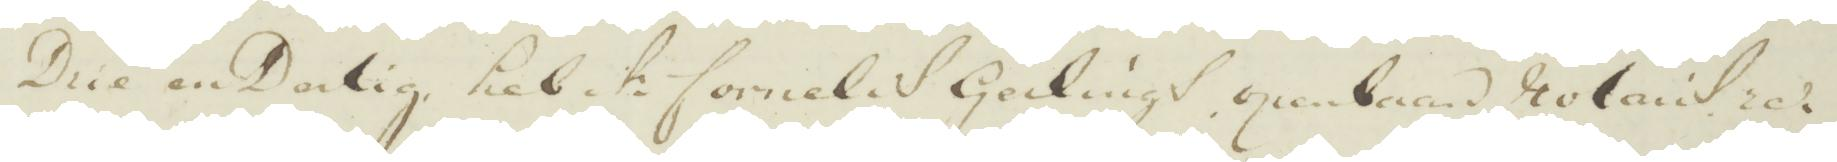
Drie en Dertig, heb ik Cornelis Gerlings, openbaar Notaris re„
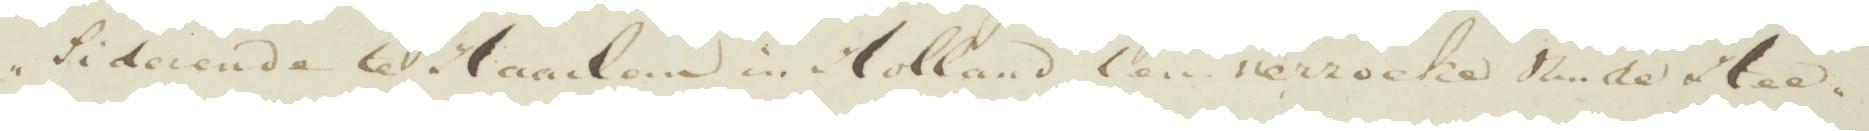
„siderende te Haarlem in Holland ten verzoeke van de Hee„
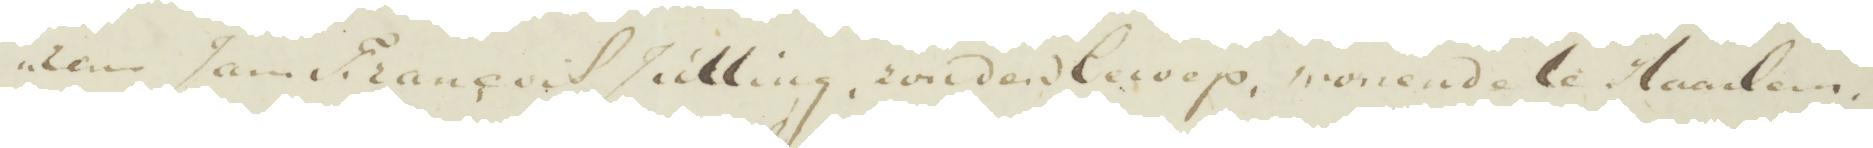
ren Jan François Jutting, zonder beroep, wonende te Haarlem,
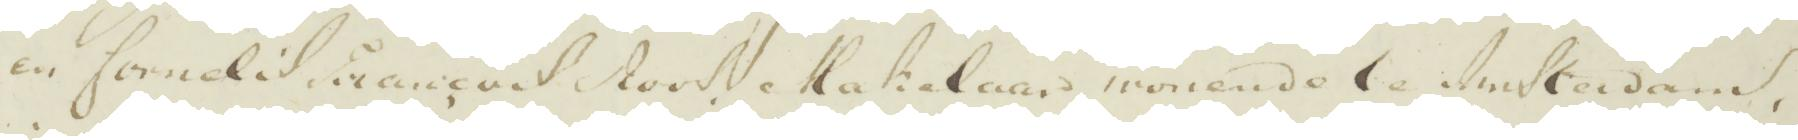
en Cornelis François Roos, Makelaar, wonende te Amsterdam,
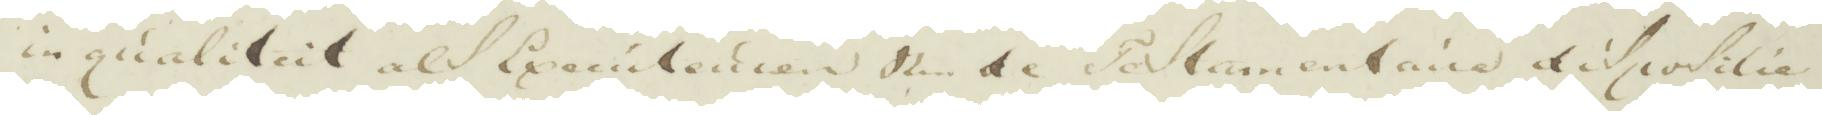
in qualiteit als Executeuren van de Testamentaire dispositie
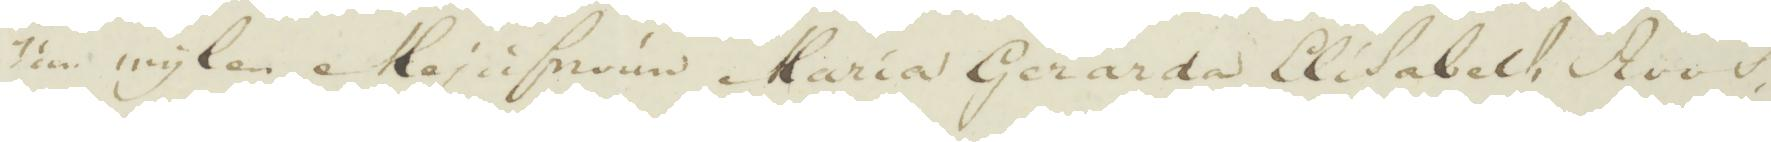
Van wijlen Mejufvrouw Maria Gerarda Elisabeth Roos,
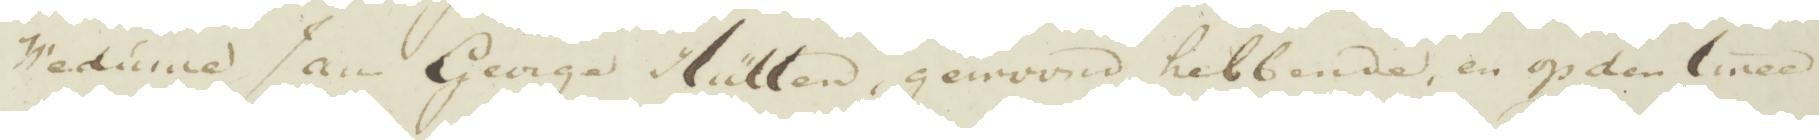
Weduwe Jan George Hüllen, gewoond hebbende, en op den twee
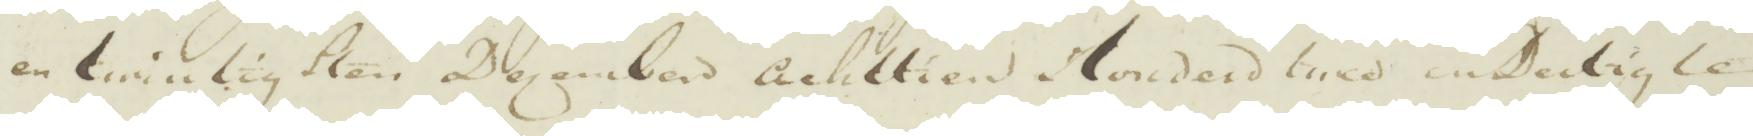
en twintigsten December Achttien Honderd twee en Dertig te
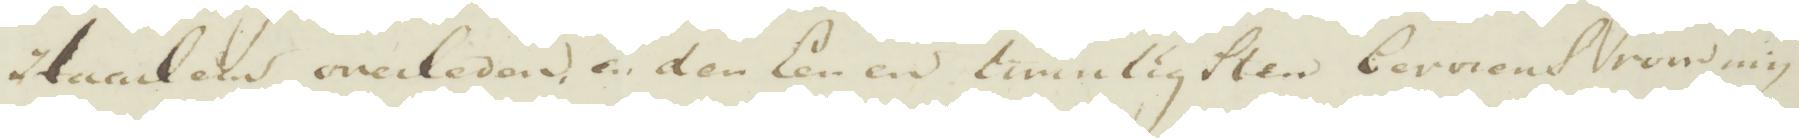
Haarlem overleden, en den Een en twintigsten bevorens voor mij
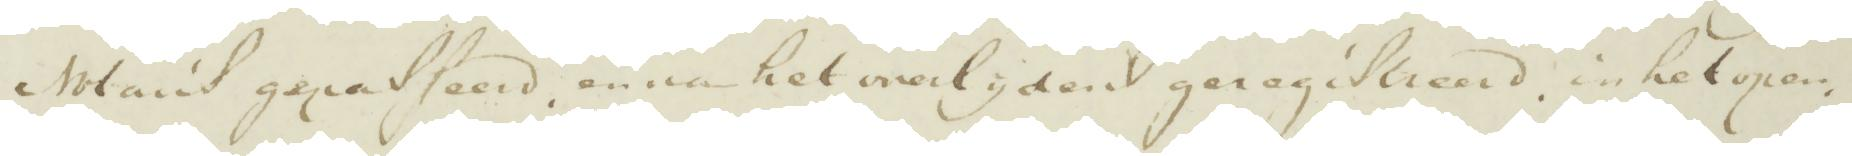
Notaris gepasseerd, en na het overlijden geregistreerd, in het open,
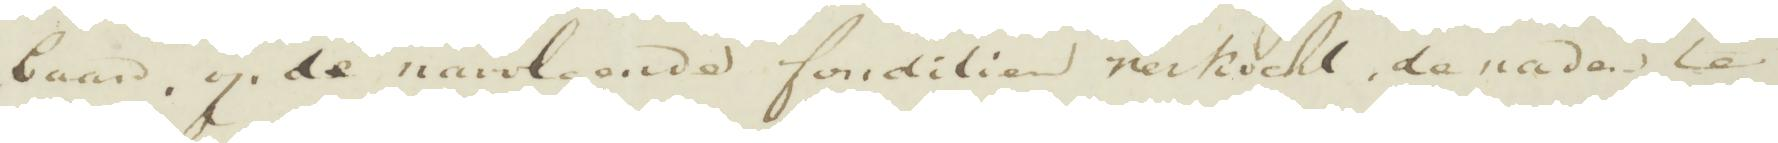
baar, op de navolgende Conditien verkocht, de nader te
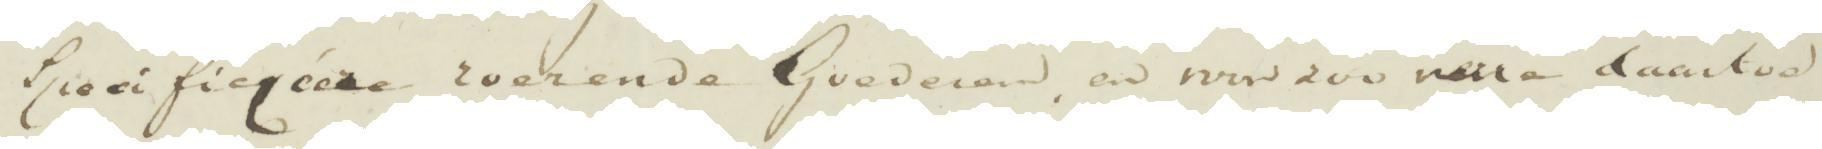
specificqéere roerende Goederen, en voor zoo verre daartoe
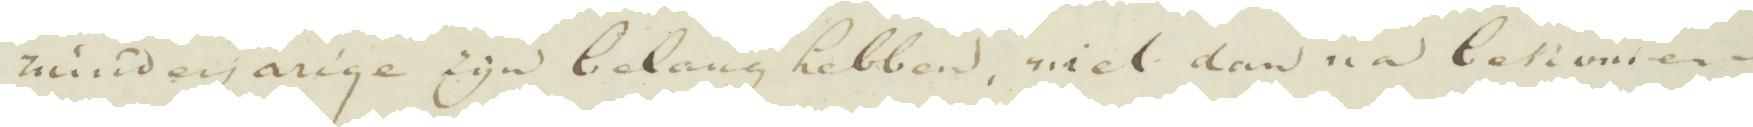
minderjarige zijn belang hebben, niet dan na bekomen
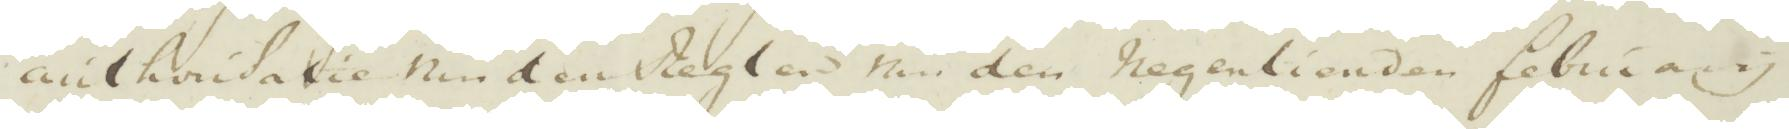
authorisatie van den Regter van den negentienden februarij
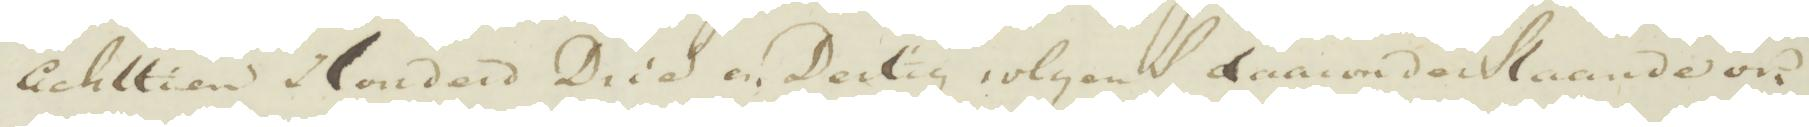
Achttien Honderd Drie en Dertig volgens daaronderstaande or„
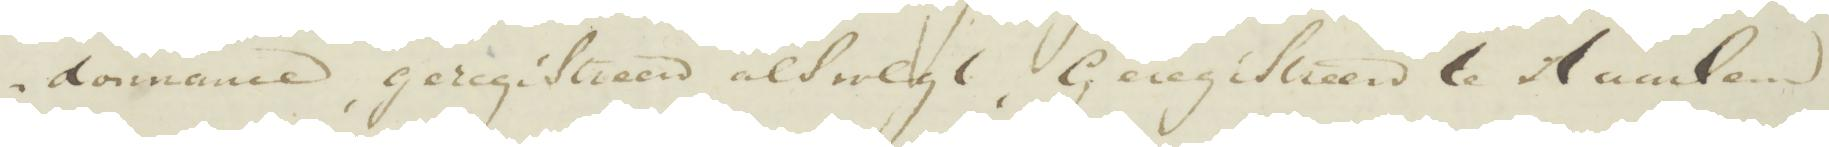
„donnance, geregistreerd als volgt, Geregistreerd te Haarlem
